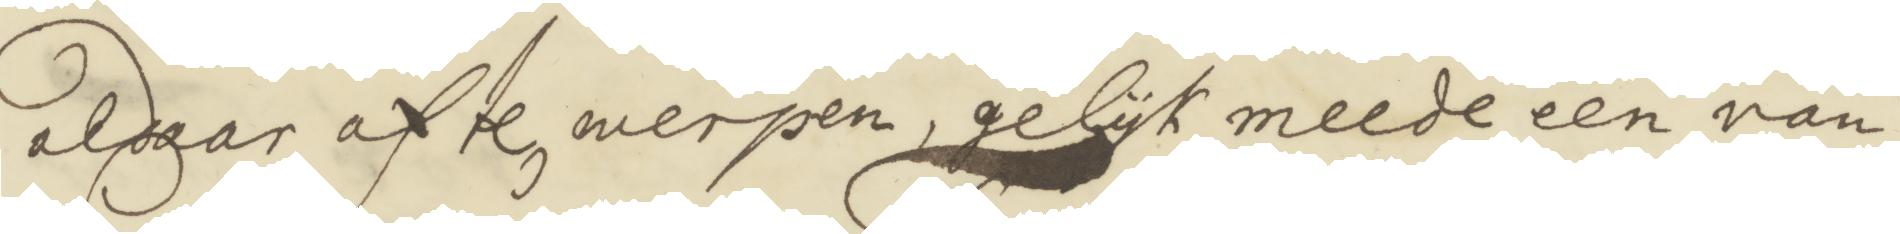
aldaar af te werpen, gelijk meede een van
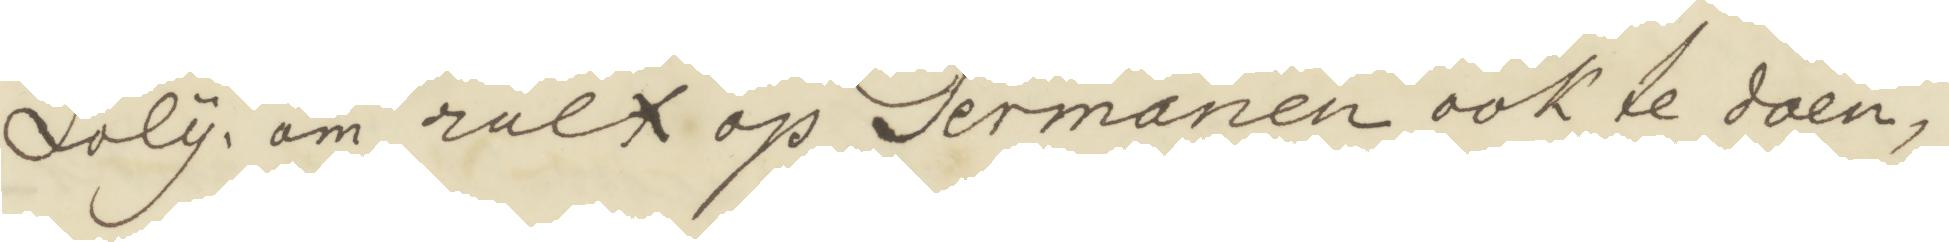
Lolij, om zulx op Termanen ook te doen,
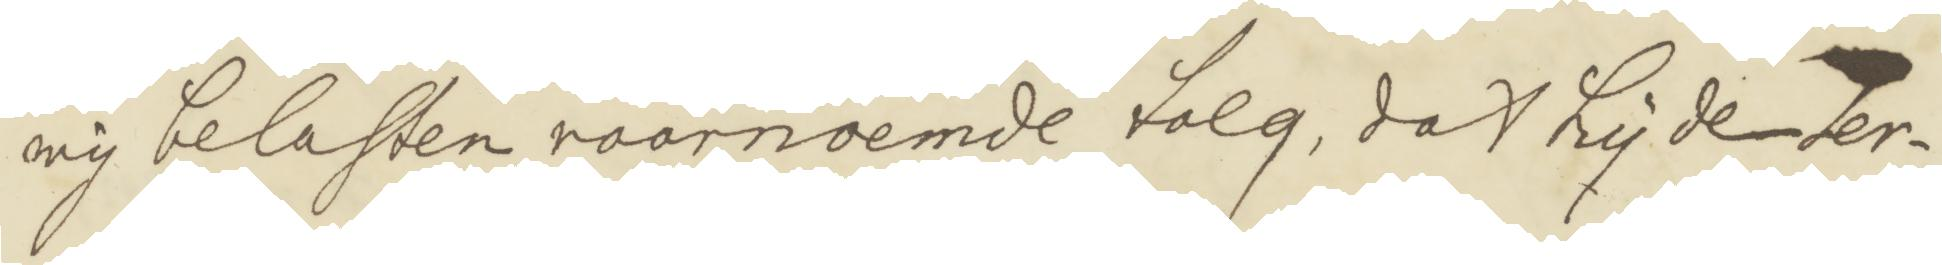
wij belasten voornoemde tolq, dat hij de ter-
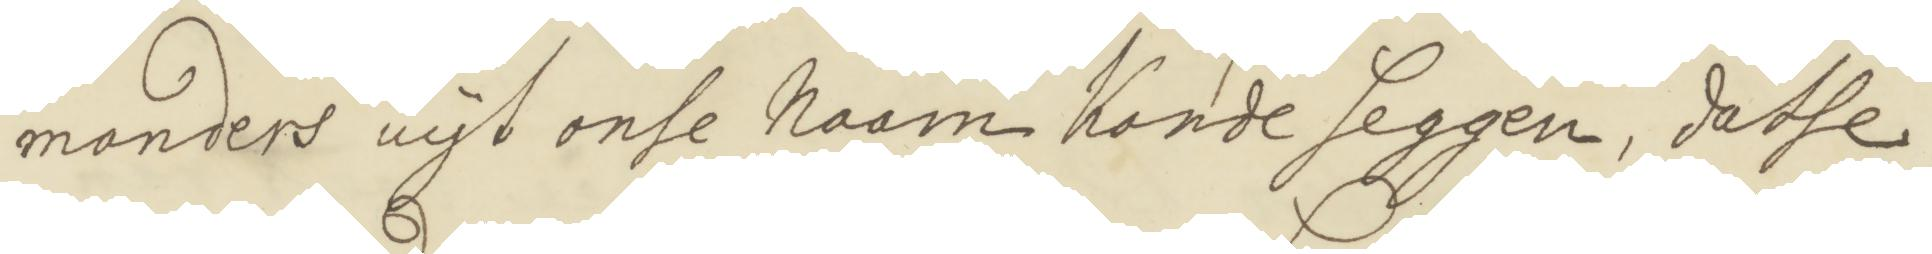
monders uijt onse naam konde seggen, datse
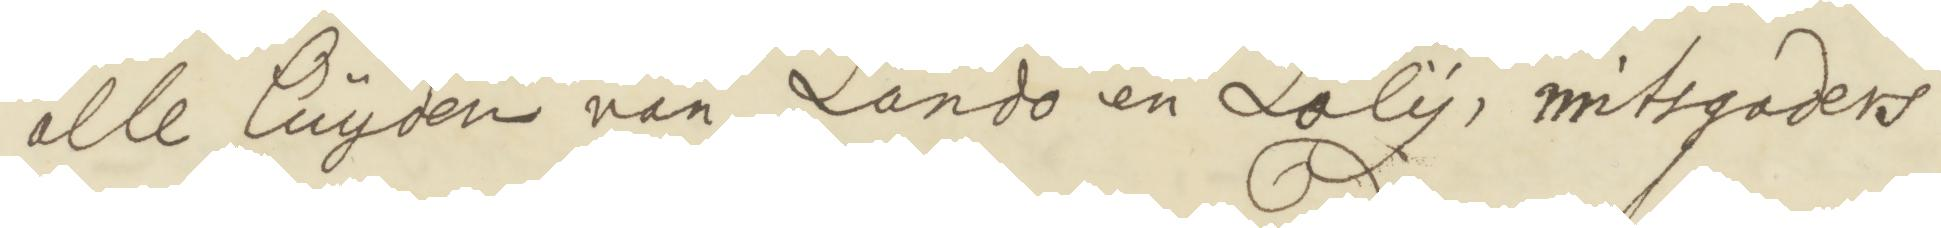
alle luijden van Lando en Lolij, mitsgaders
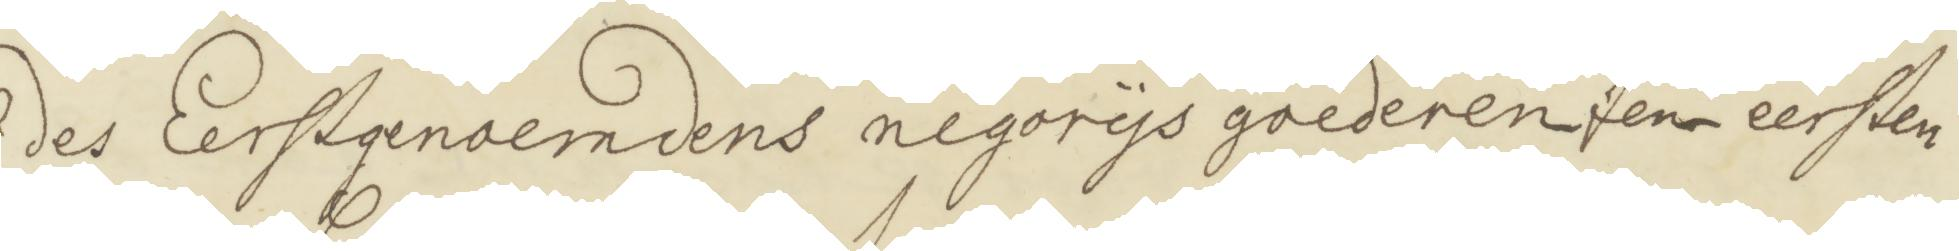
des Eerstgenoemdens negorijs goederen ten eersten
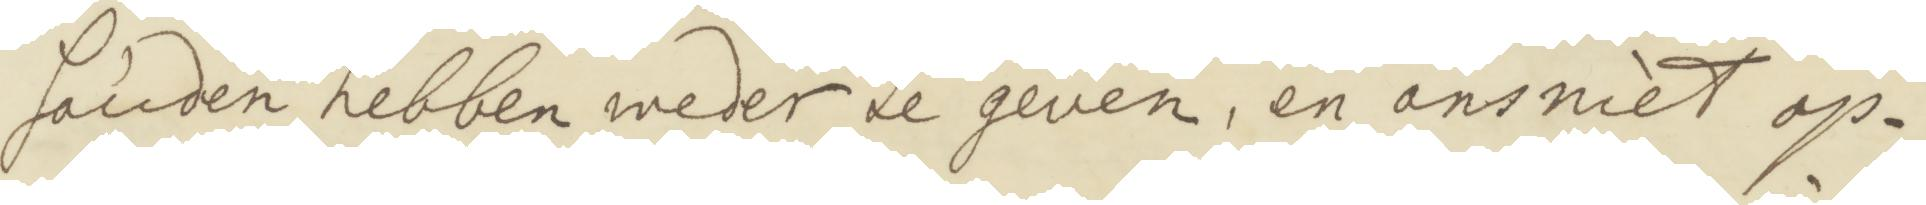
souden hebben weder te geven, en ons niet op-
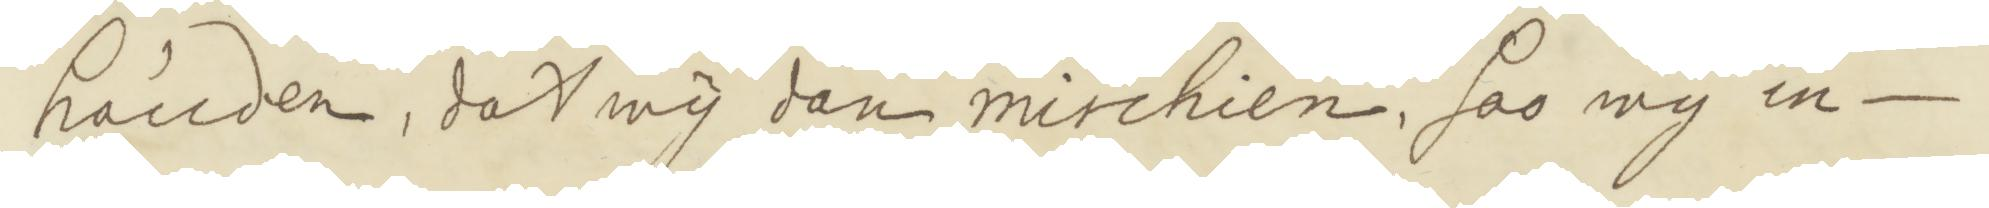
houden, dat wij dan mischien, soo wij in —
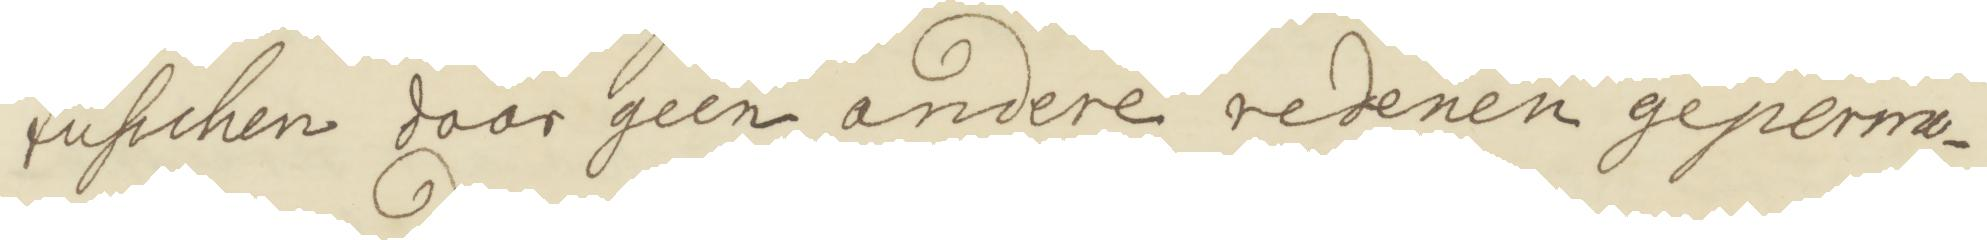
tusschen door geen andere redenen geperme-
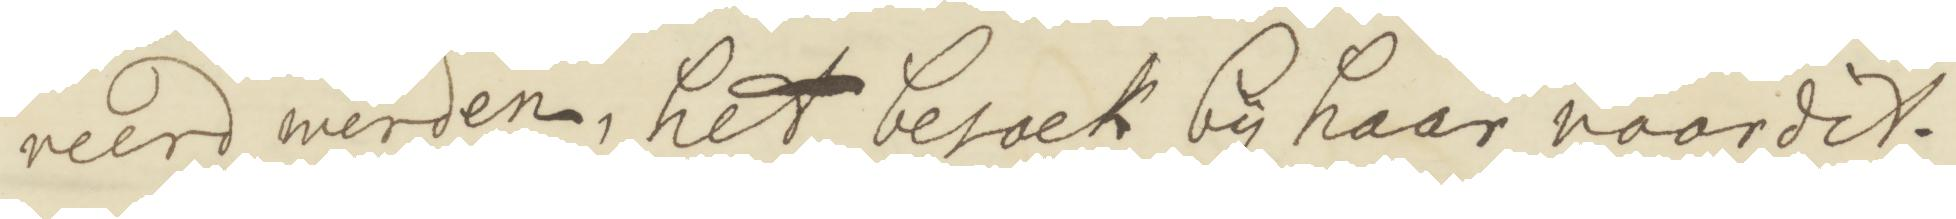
veerd werden, het besoek bij haar voor dit-
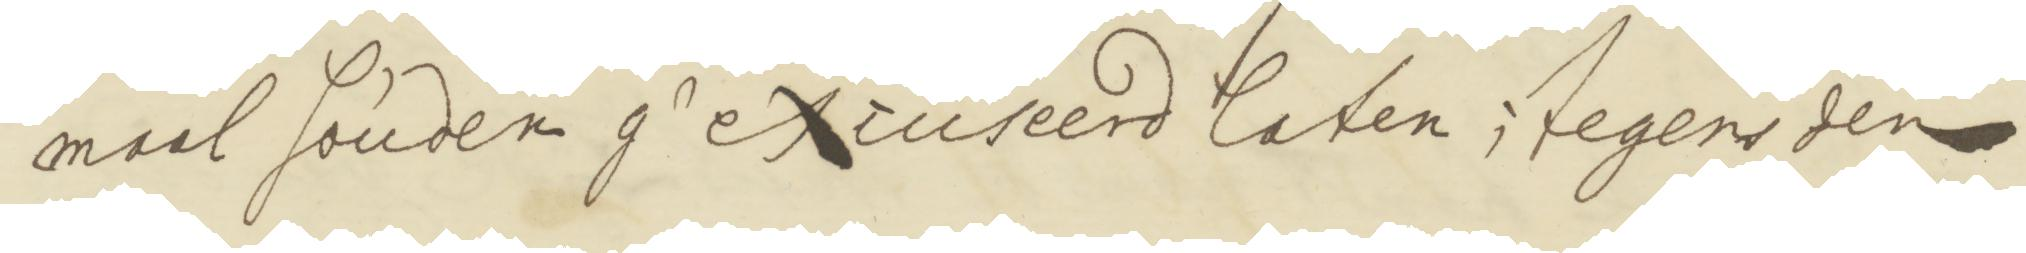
maal souden g’ excuseerd laten; tegens den
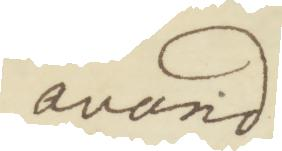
avond
